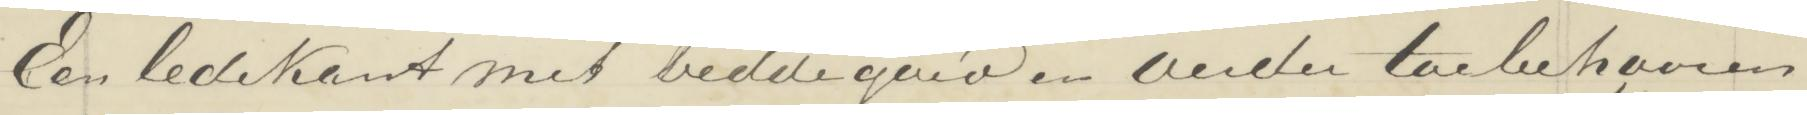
Een ledikant met beddegoed en verder toebehooren
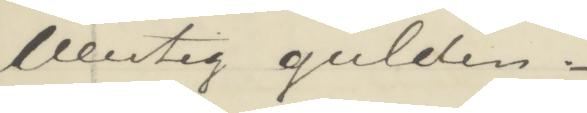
veertig gulden.
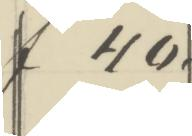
ƒ 40
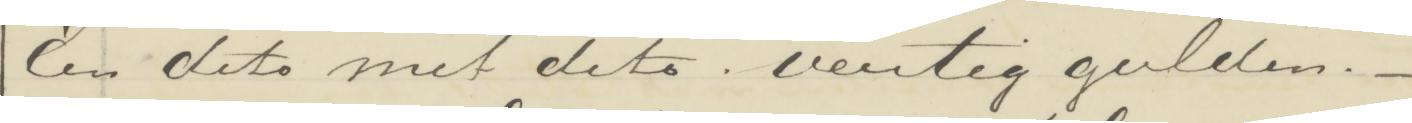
Een dito met dito. veertig gulden.—
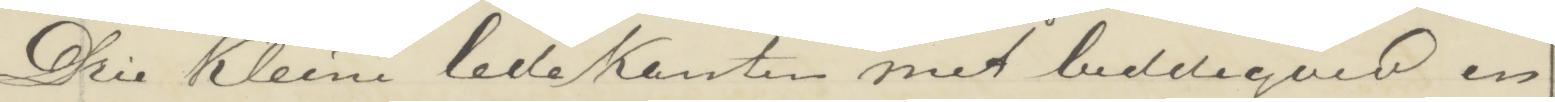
Drie kleine ledekanten met beddegoed en
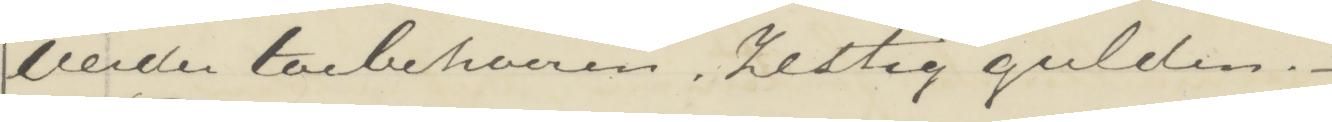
verder toebehoeren, zestig gulden.
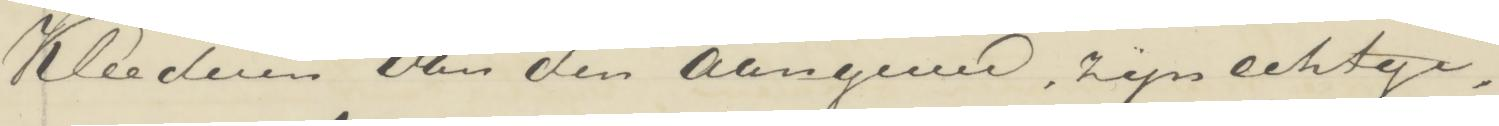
Kleederen van den aangever, zijn echtge„
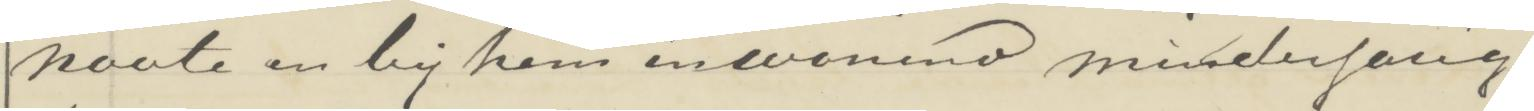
noote en bij hem inwonend minderjarig
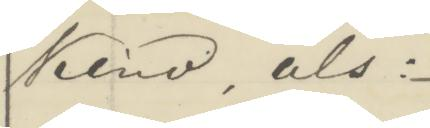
kind, als:
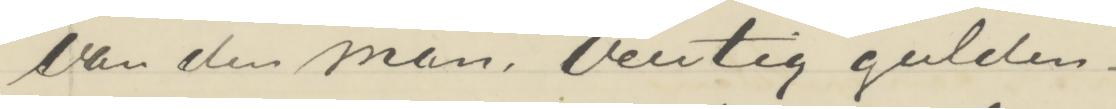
van den man, veertig gulden.
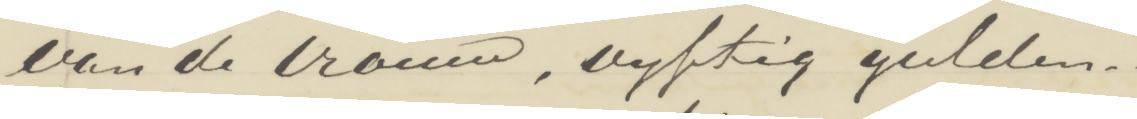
van de vrouw, vyftig gulden.
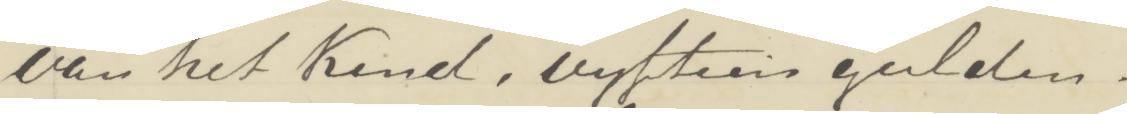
van het kind, vyftien gulden.
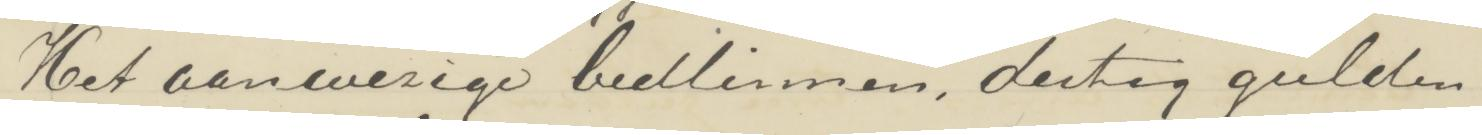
Het aanwezige bedlinnen, dertig gulden
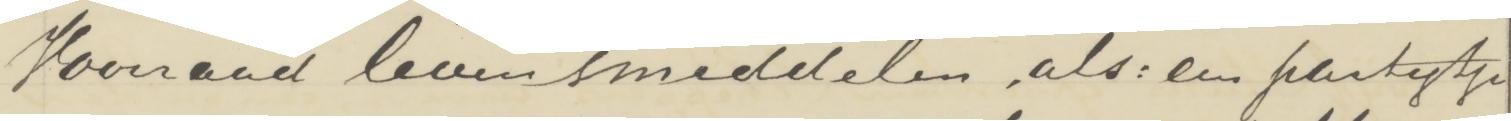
Voorraad levensmiddelen, als: een partytje
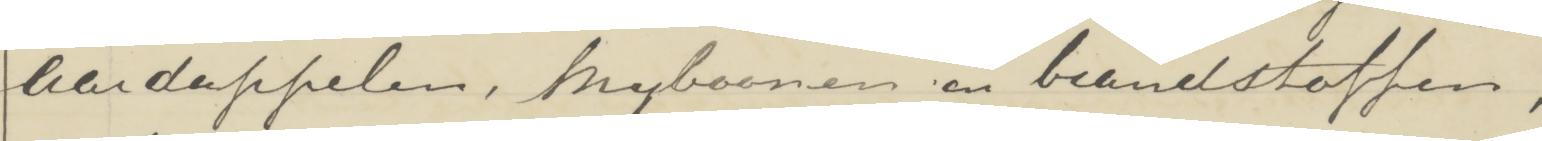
aardappelen, snyboonen en brandstoffen
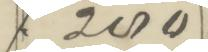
ƒ 280
